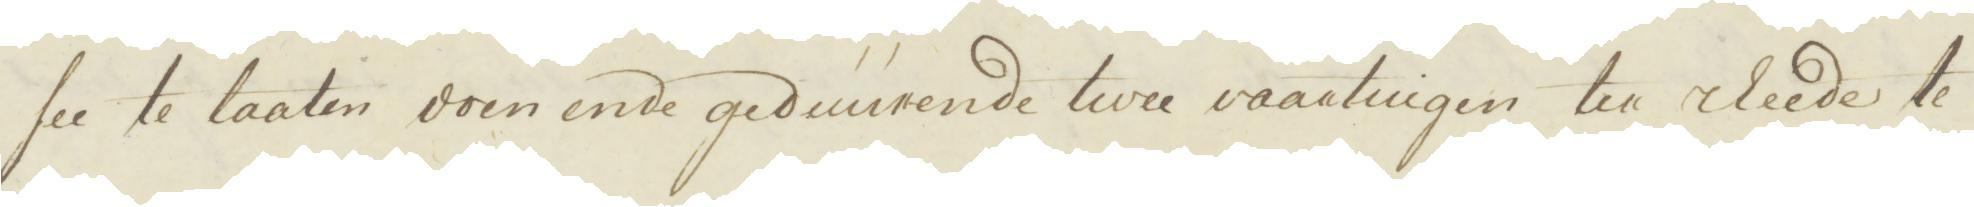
see te laaten doen ende geduurende twee vaartuigen ter rheede te
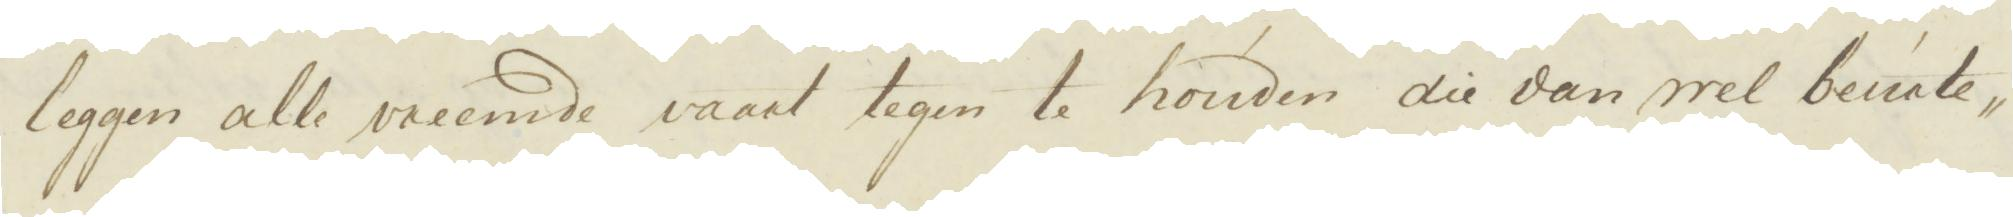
leggen alle vreemde vaart tegen te houden die dan wel beurte„
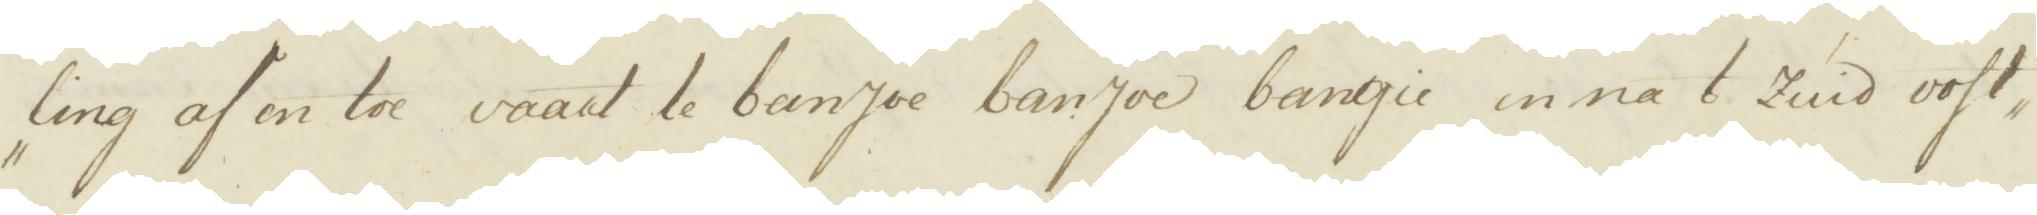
„ling af en toe vaart te banjoe banjoe bangie en na ’t zuid oost„
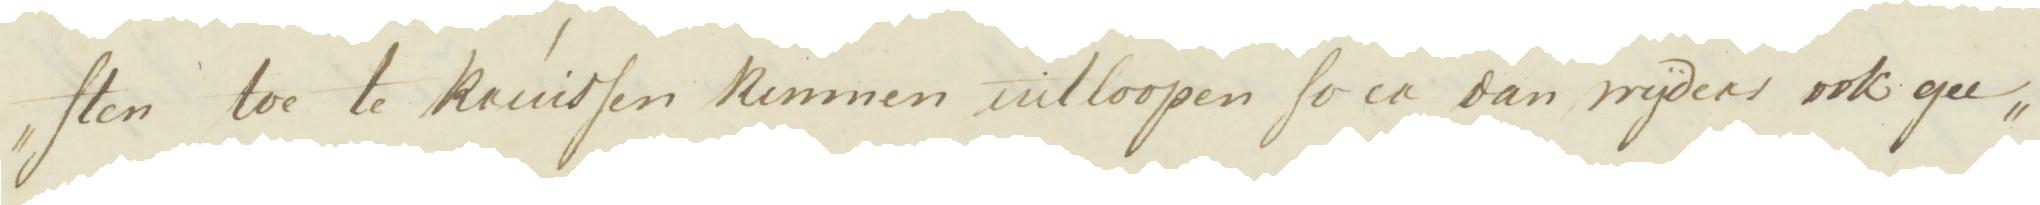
„sten toe te kruissen kunnen uitloopen so er dan wijders ook gee„
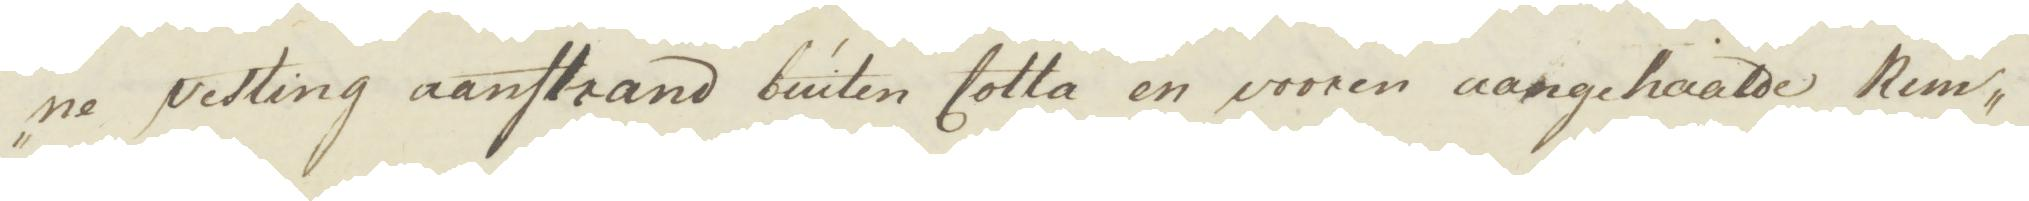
„ne vesting aanstrand buiten Cotta en vooren aangehaalde kun„
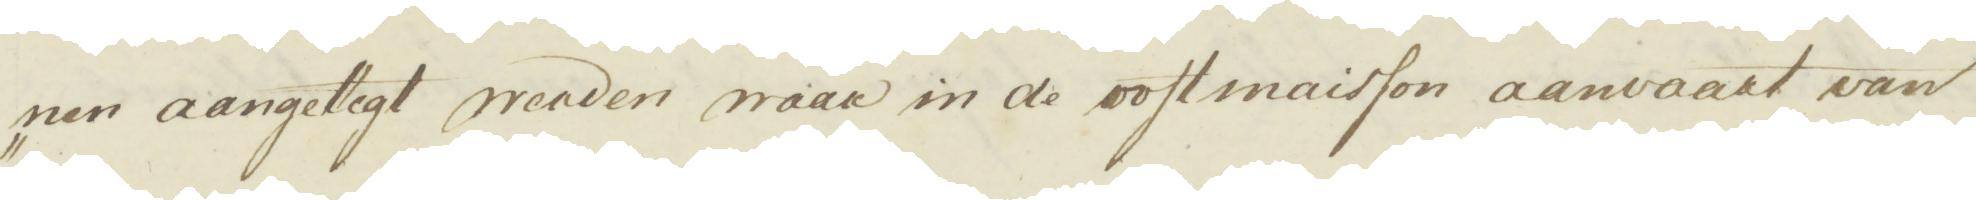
„nen aangetegt werden waar in de oostmaisson aanvaart van
